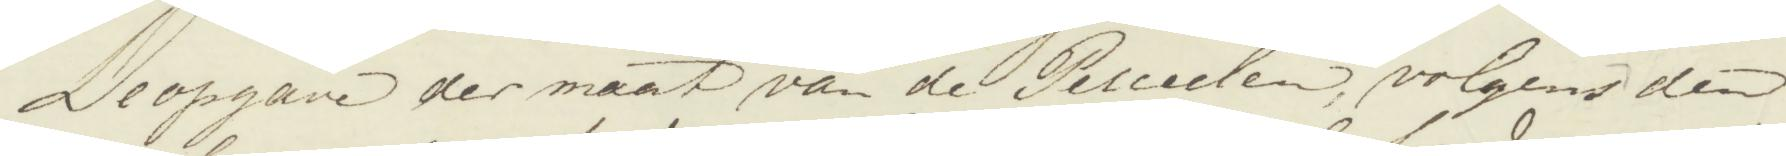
De opgave der maat van de Perceelen, volgens den
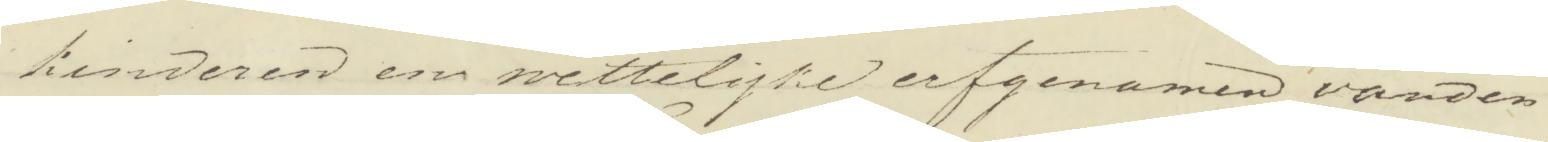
kinderen en wettelijke erfgenamen vanden
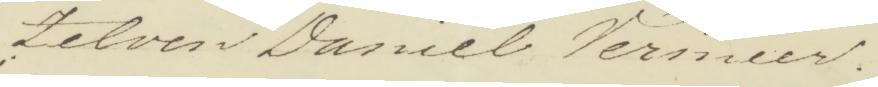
Zelven Daniel Vermeer.
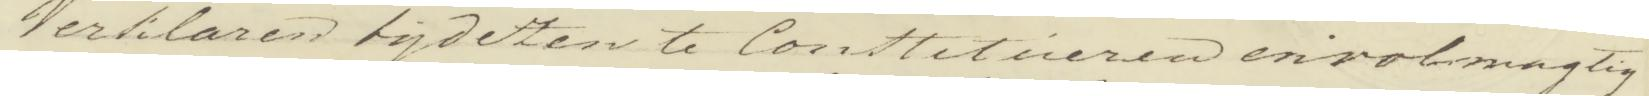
Verklaren bij deZen te Constitueren en volmagtig
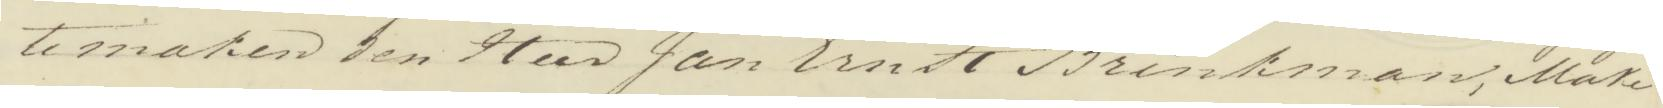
te maken den Heer Jan Ernst Brinkman, Make
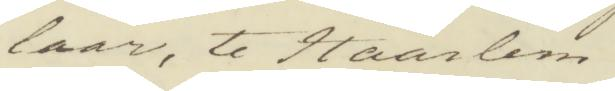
laar, te Haarlem
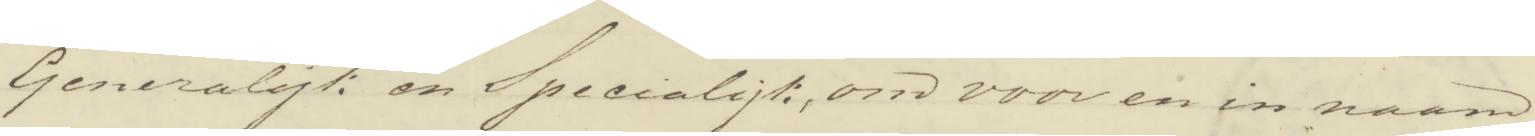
Generalijk en Specialijk, om voor en in naam
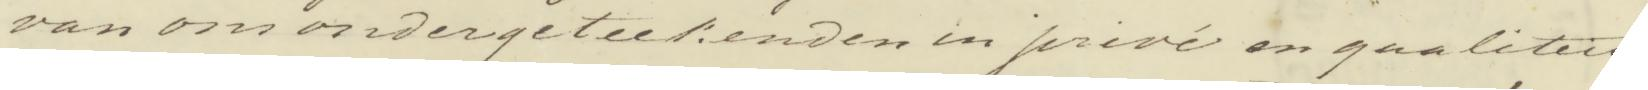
van ons ondergeteekenden in privé en qualiteit
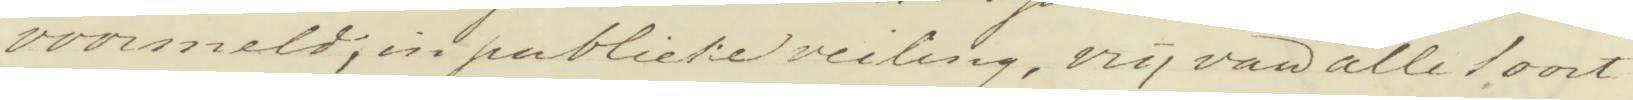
voormeld, in publieke veiling, vrij van alle soort
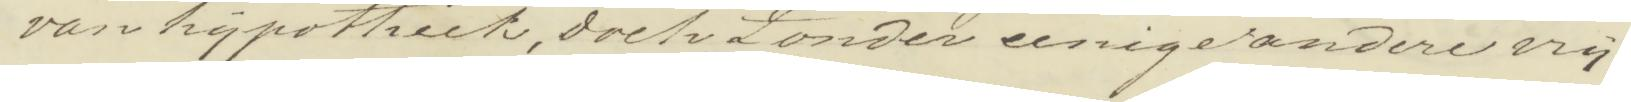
van hijpotheek, doch Zonder eenige andere vrij
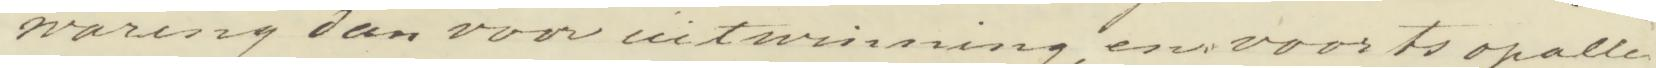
waring dan voor uitwinning en voorts op alle
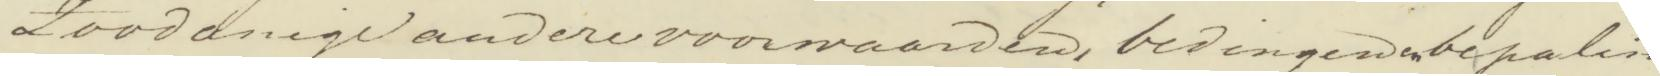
zoodanige andere voorwaarden, bedingen en bepalin
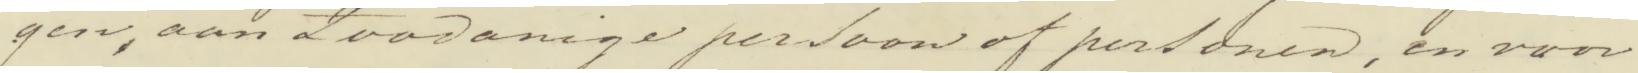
gen, aan Zoodanige persoon of personen, en voor
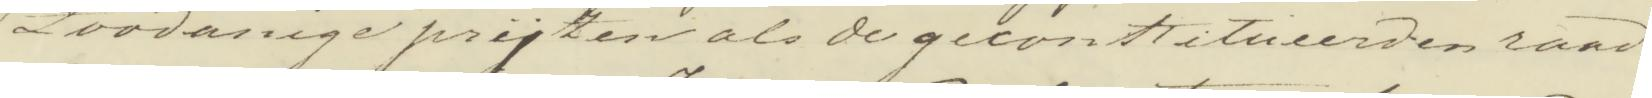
Zoodanige prijZen als de geconstitueerden raad
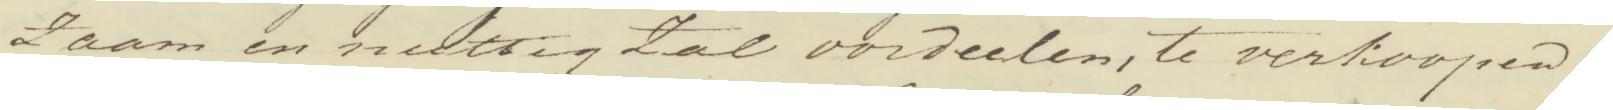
Zaam en niettig Zal oordeelen, te verkoopen:
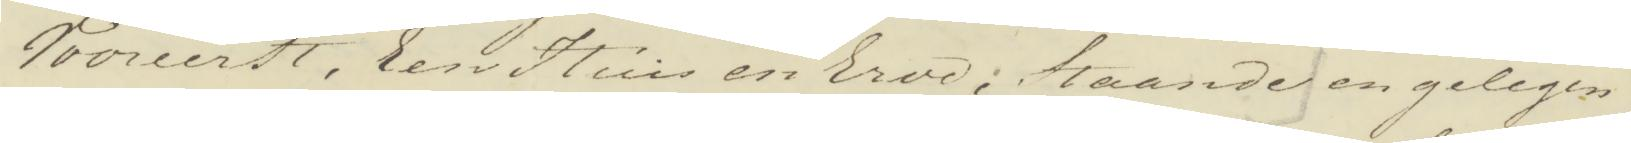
Vooreerst, Een Huis en Erve; Staande en gelegen
